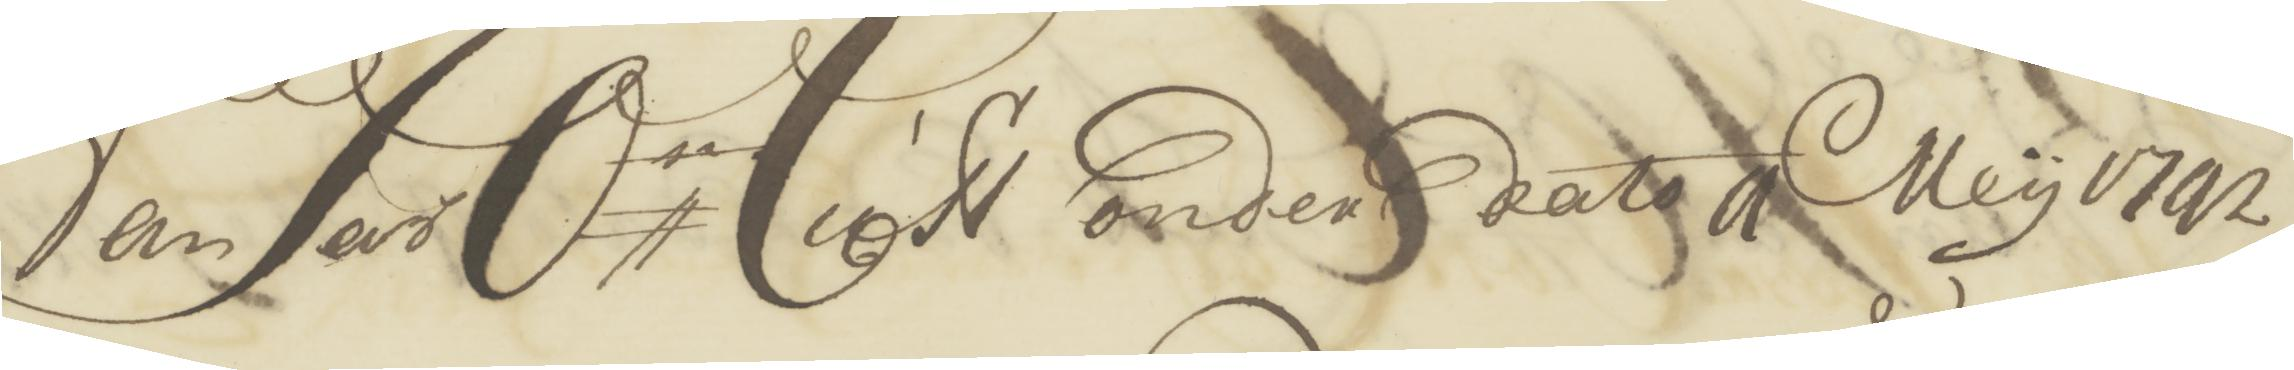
Van Javs O#st Cust onder dato 4 Meij 1742.
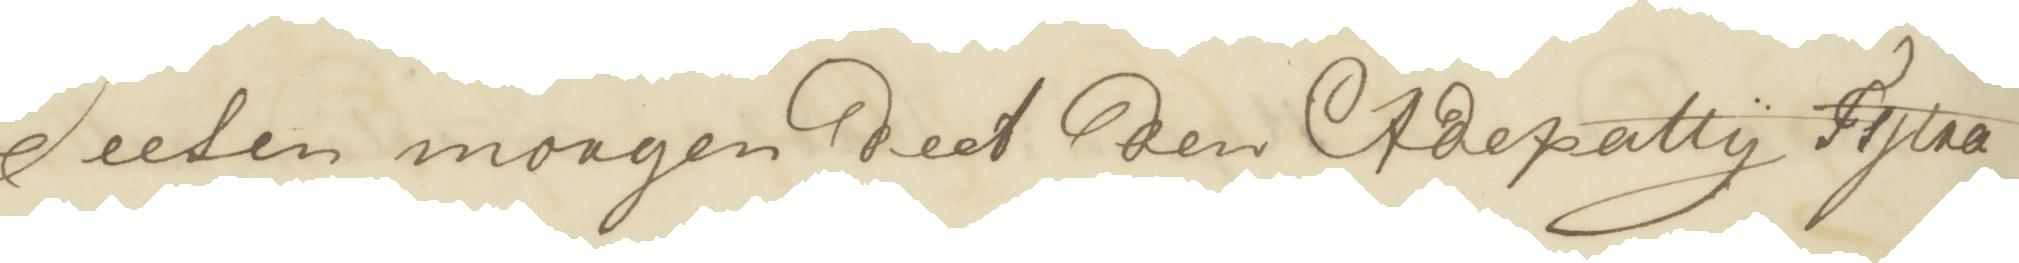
Deesen morgen deet den Adepattij Tsjtra
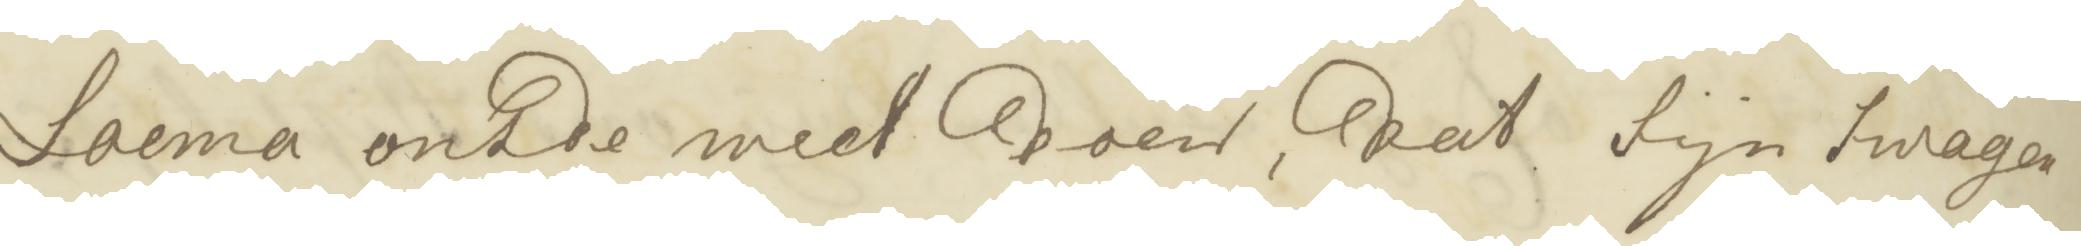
soema ons de weet doen, dat sijn swager
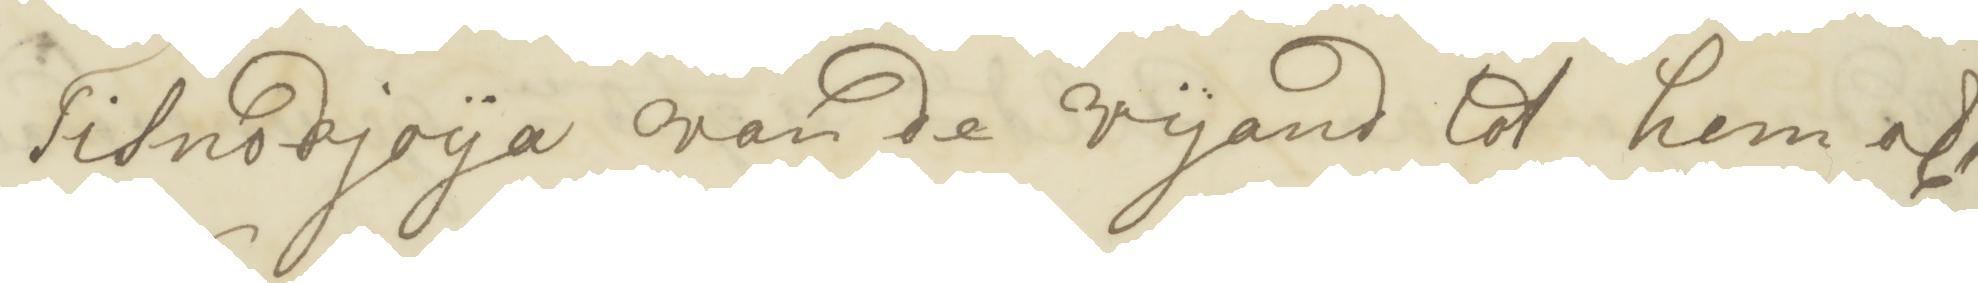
Tisnodjoija van de vijand tot hem over
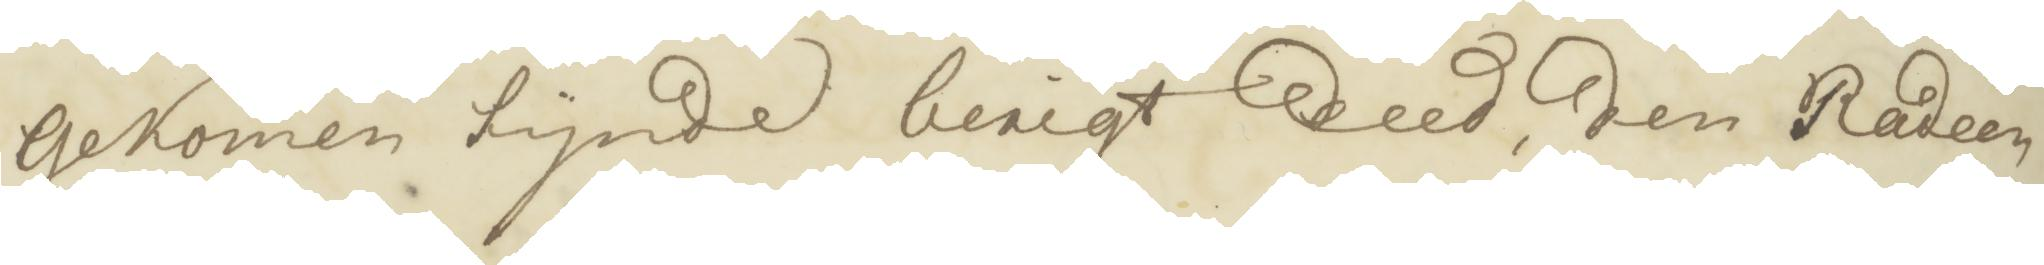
gekomen sijnde berigt deed, den Radeen
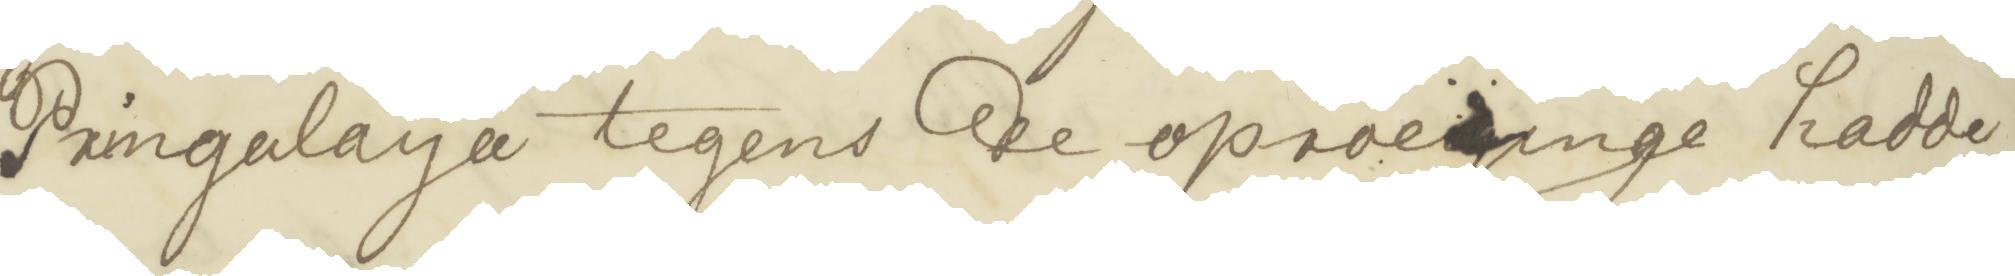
Pringalaija tegens de oproeyinge hadde
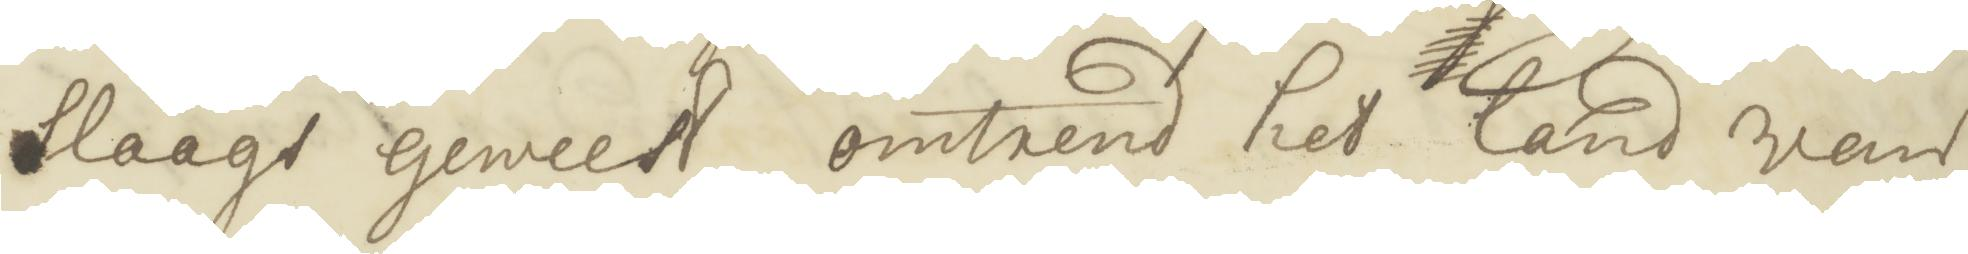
slaags geweest omtrend het land van
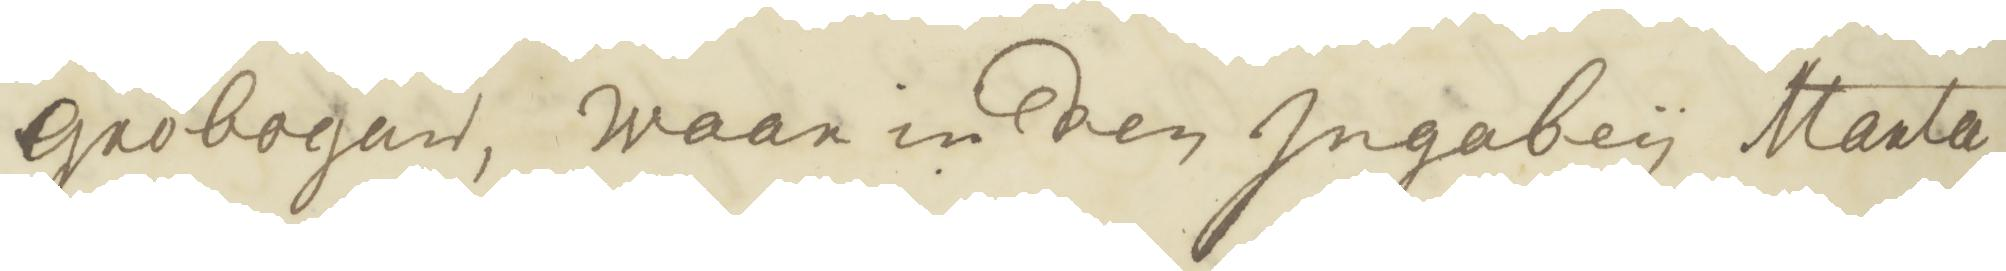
grobogan, waar in den Jngabeij Marta
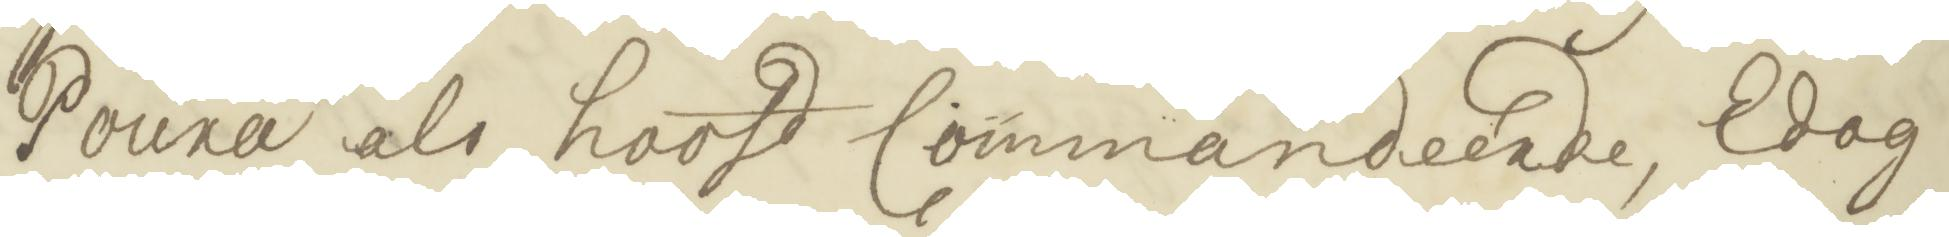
Poura als hoofd Commandeerde, Edog
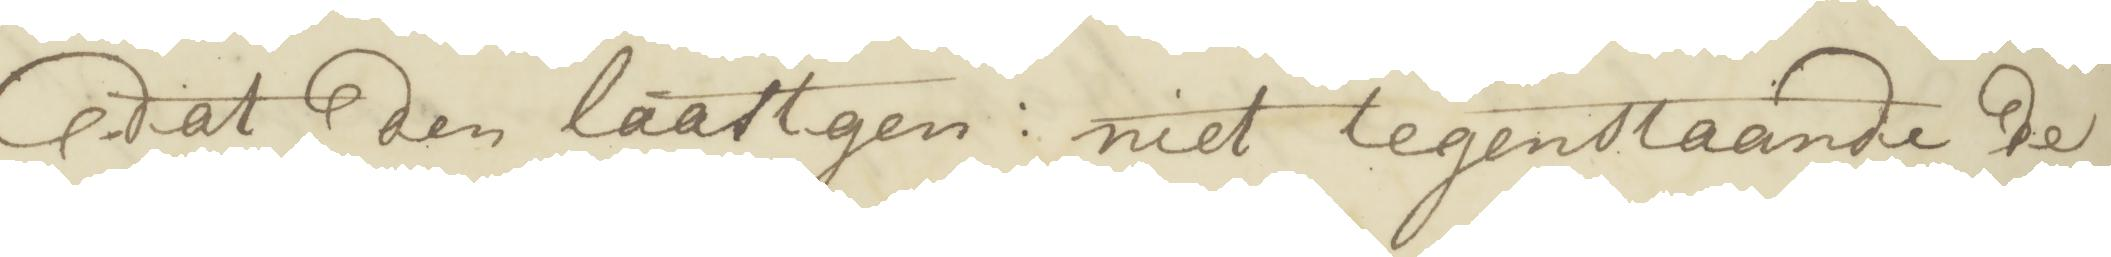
dat den laastgen: niet tegenstaande de
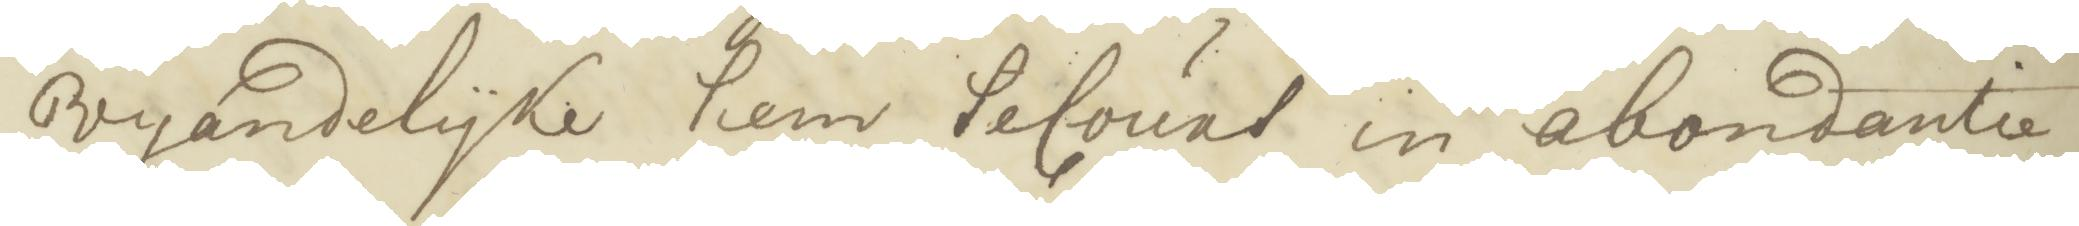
vijandelijke hem secours in abondantie
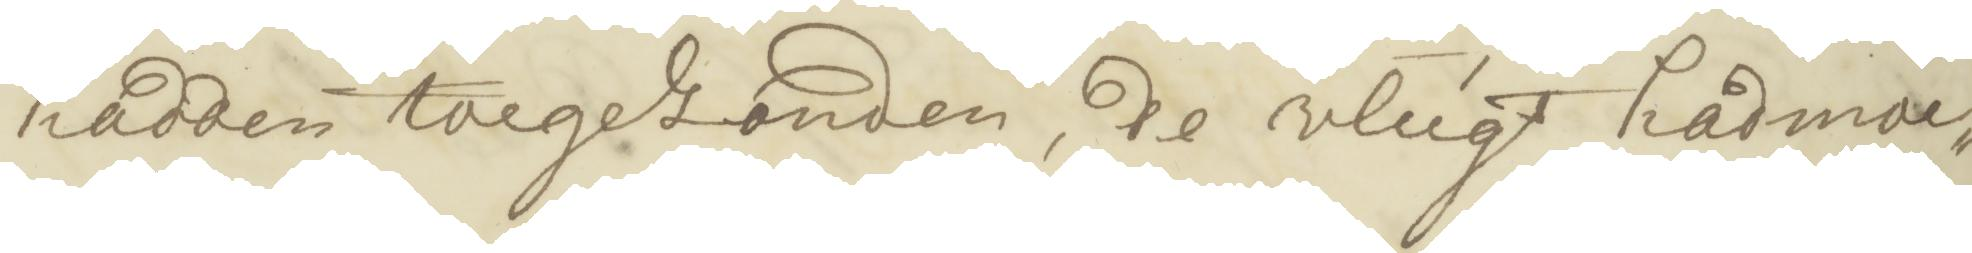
hadden toegezonden, de vlugt had moe„
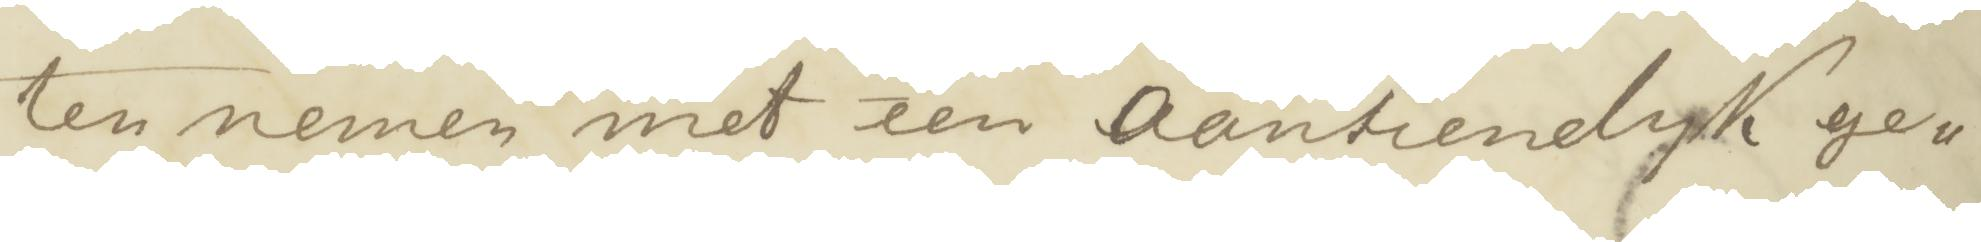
ten nemen met een aansienelyk ge
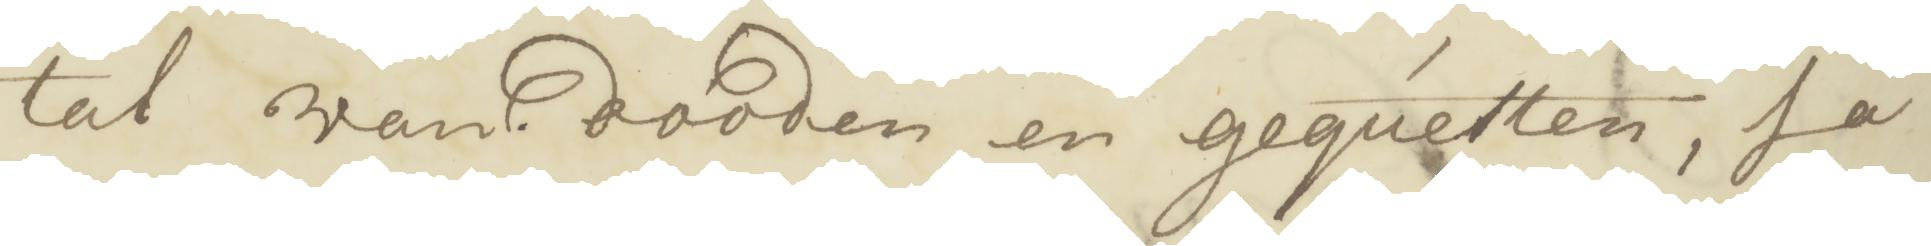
tal van dooden en gequesten, ja
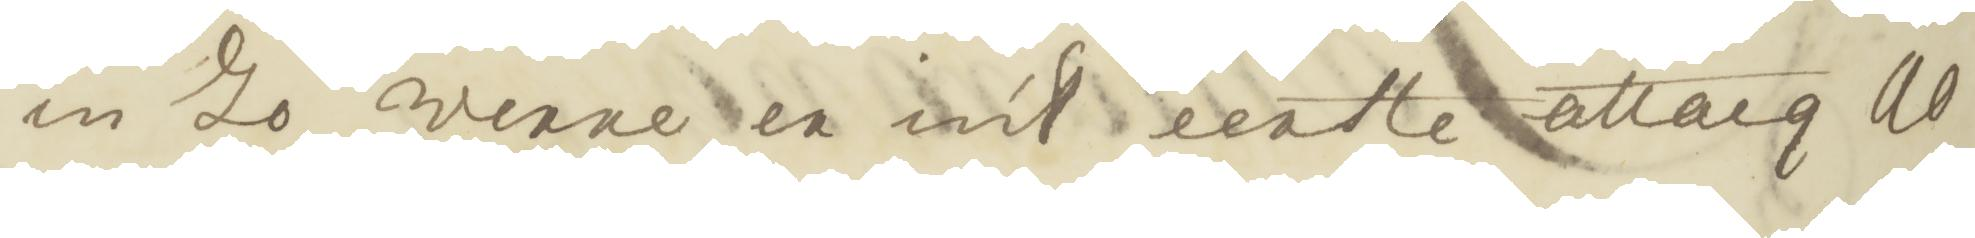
in zo verre er in't eerste attacq 40
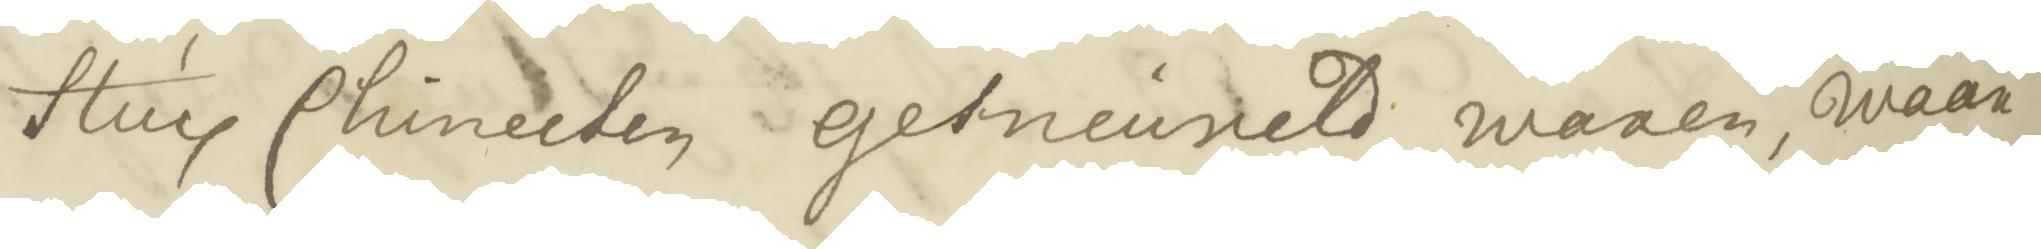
stux Chineesen gesneuveld waren, waar
